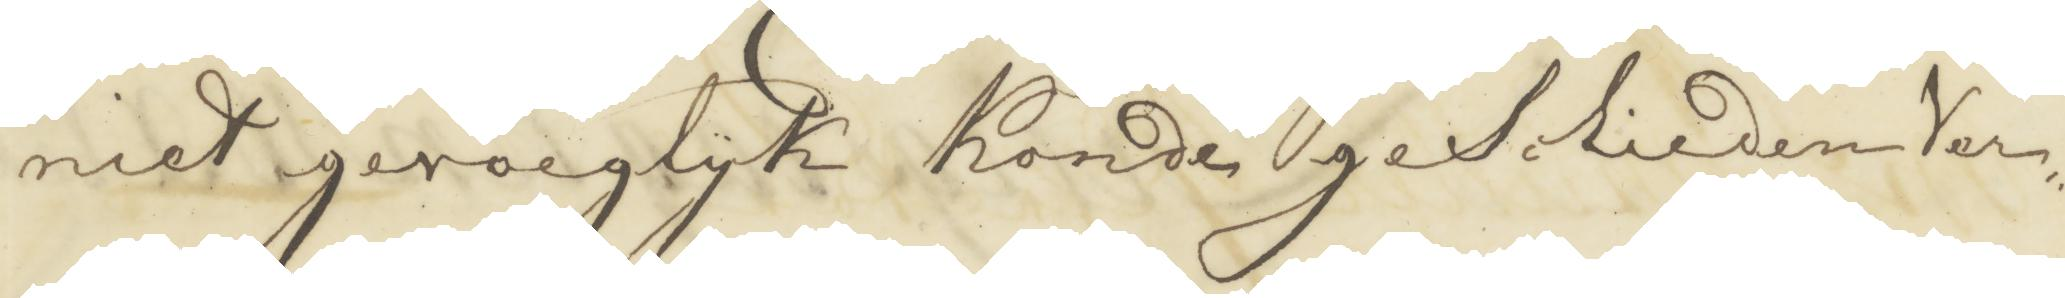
niet gevoeglijk konde geschieden ver„
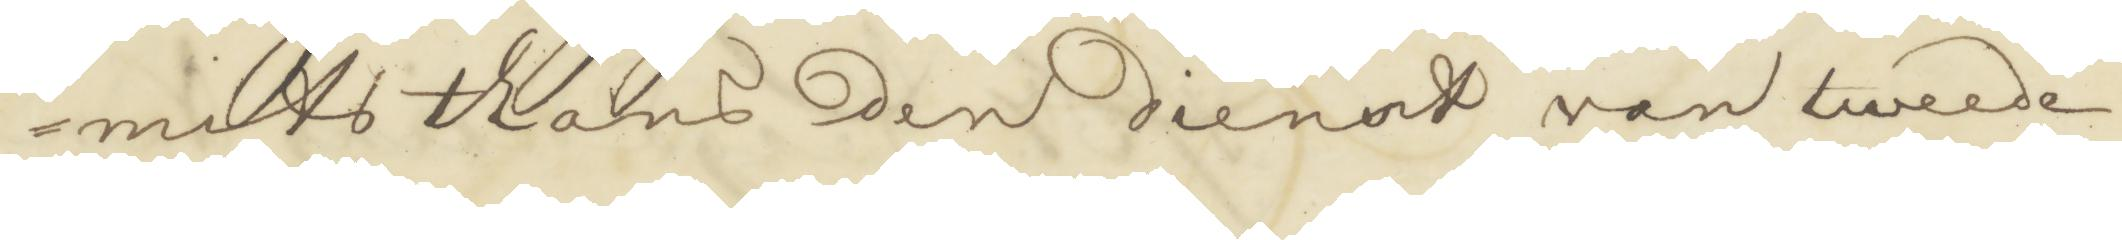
=mits thans den dienst van tweede
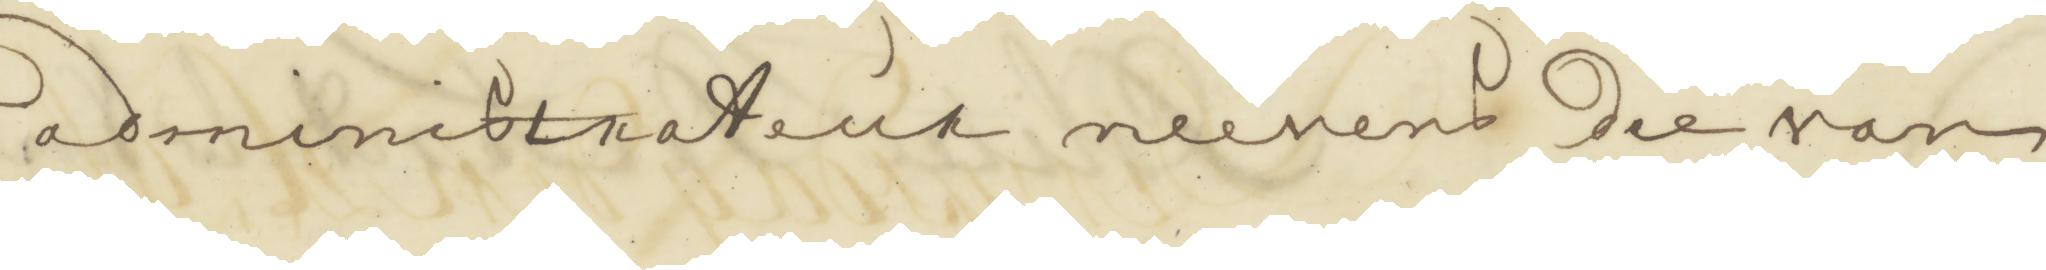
administrateur neevens die van
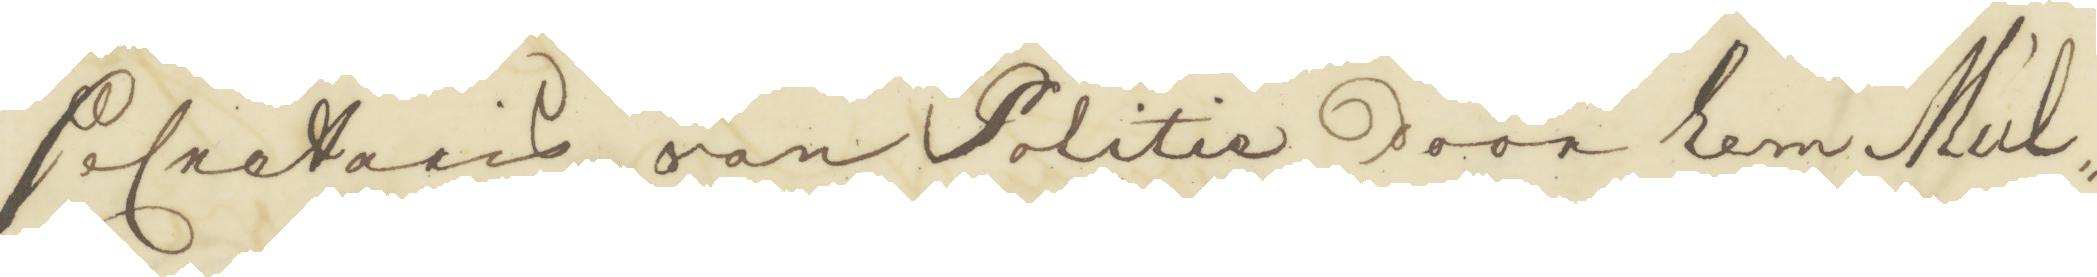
Secrataris van Politie door hem Mul„
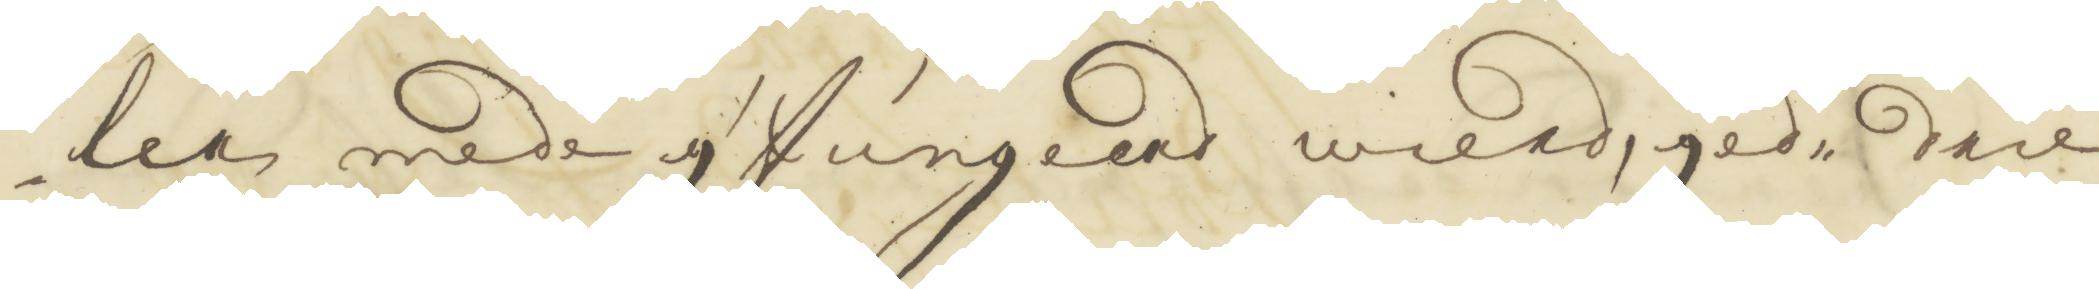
=ler mede g'fungeerd wierd, ged„t drie
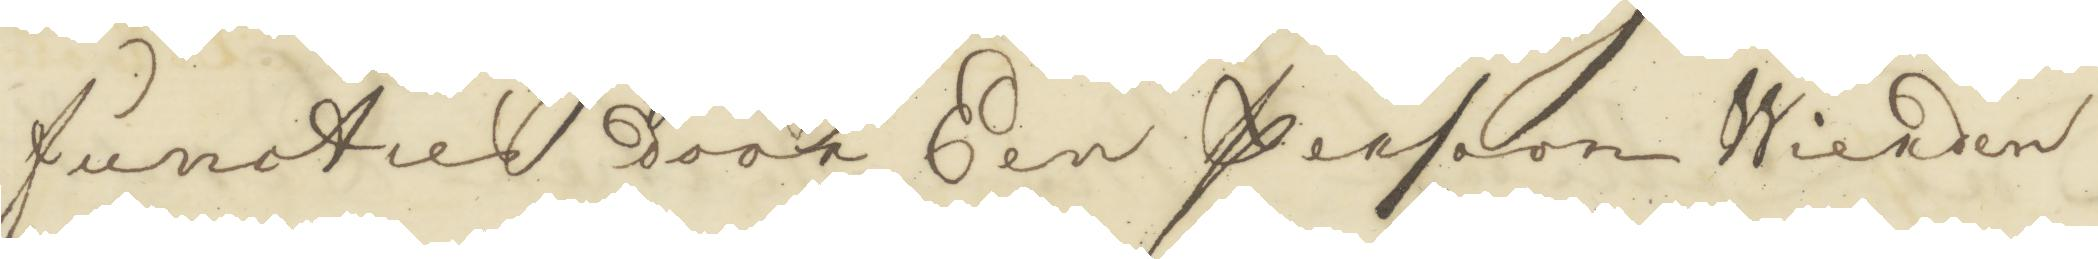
functies door Een persoon wierden
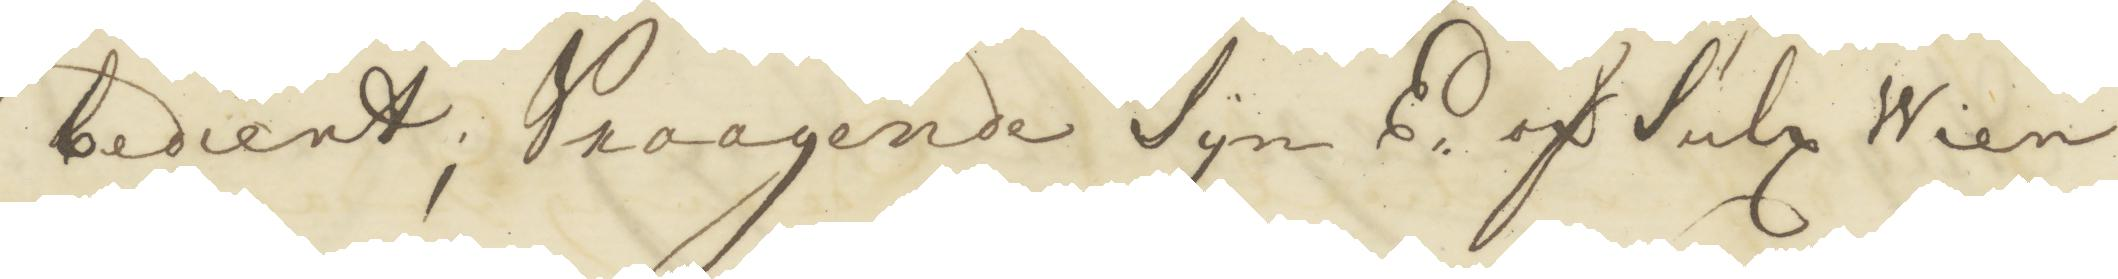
bedient; vraagende sijn E„ of sulx wien
